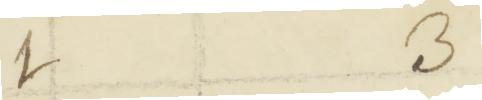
1 3
